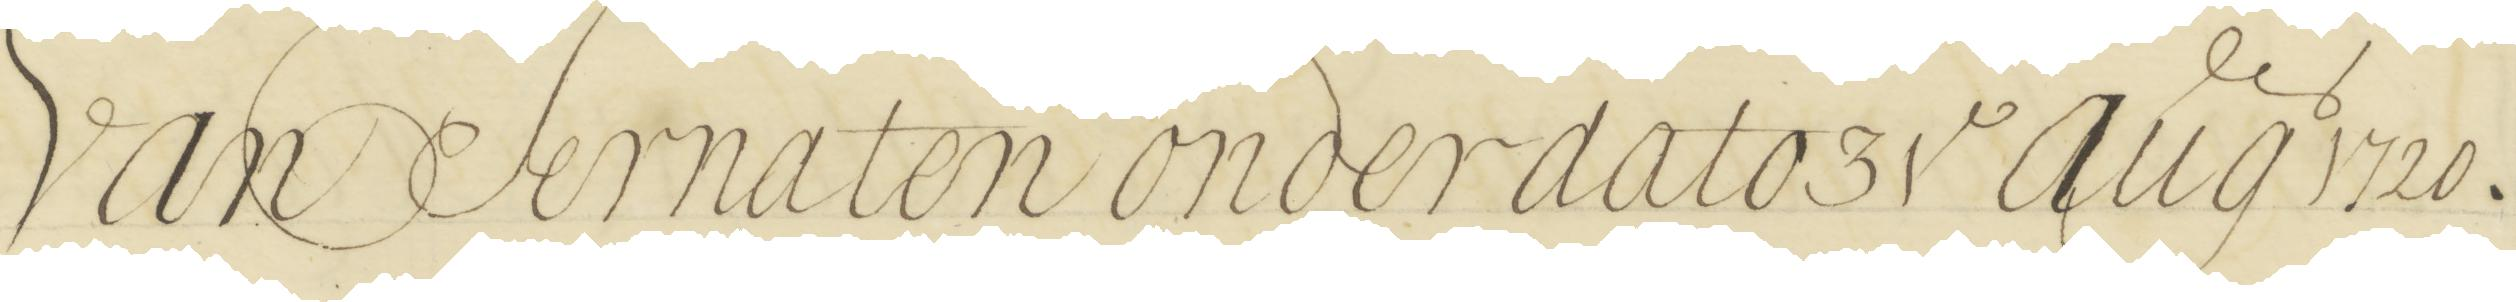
Van Ternaten onder dato 31e Aug:s 1720.
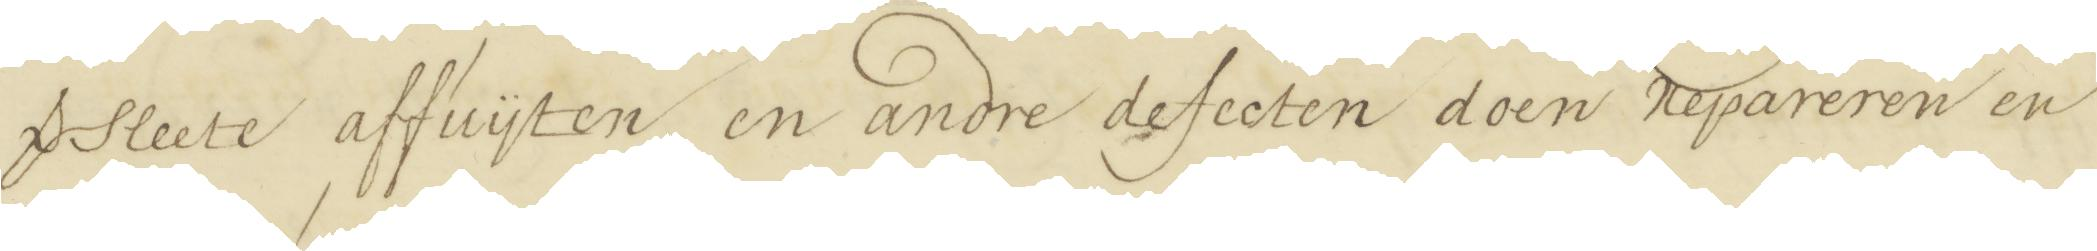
versleete affuijten en andre defecten doen repareren en
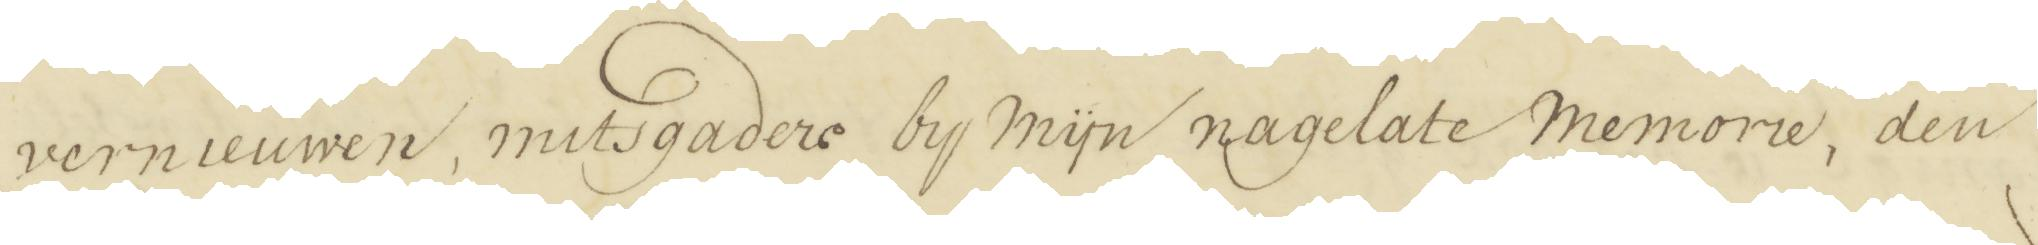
vernieuwen, mitsgaders by mijn nagelate memorie, den
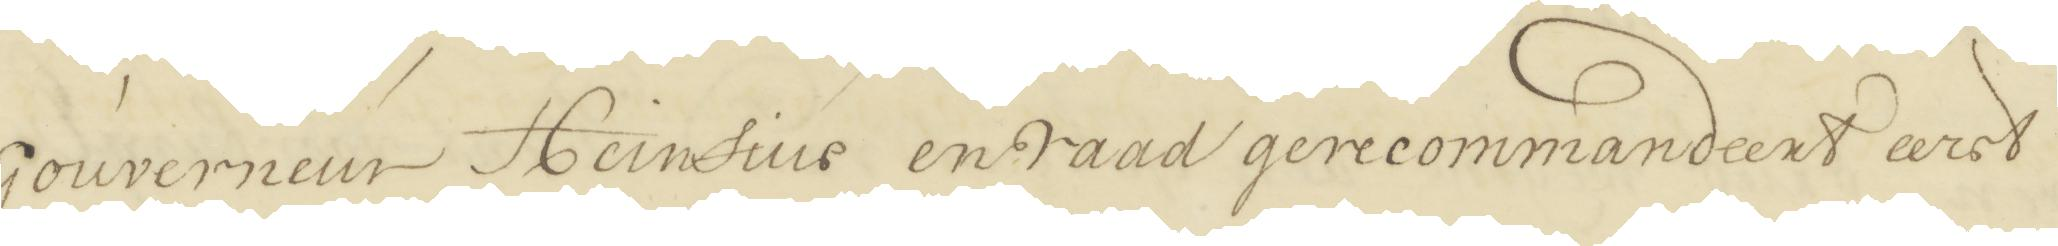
Gouverneur Heinsius en raad gerecommandeert eerst
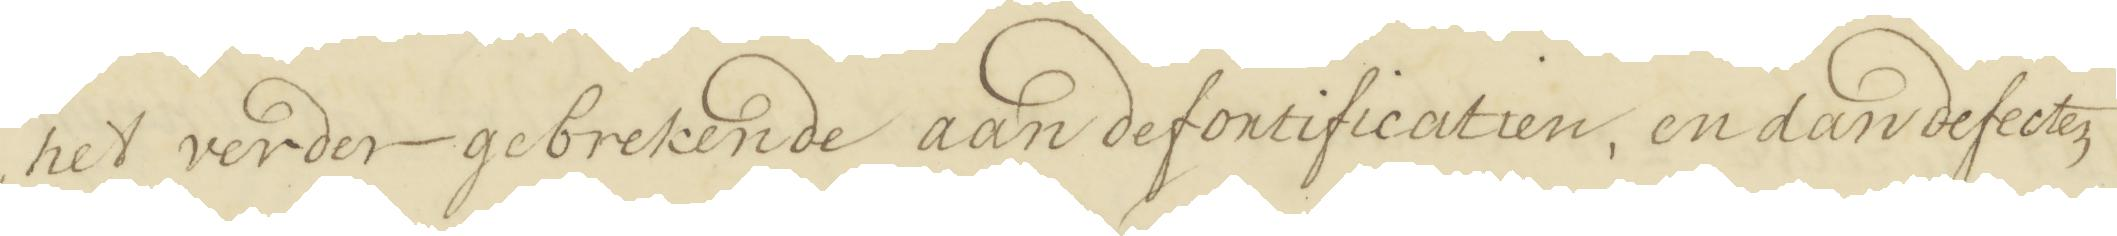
het verder gebrekende aan de fortificatien, en dan defecten
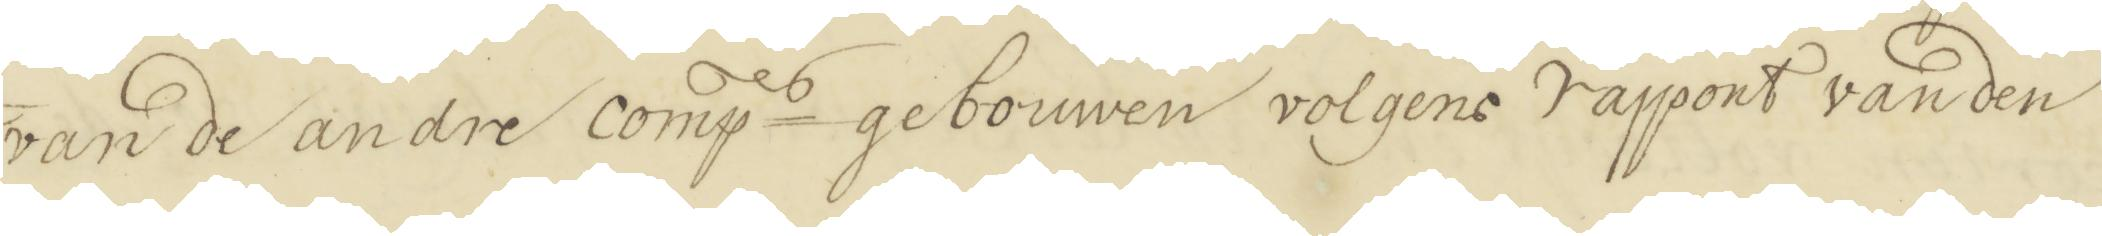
van de andre Comp=s gebouwen volgens rapport van den
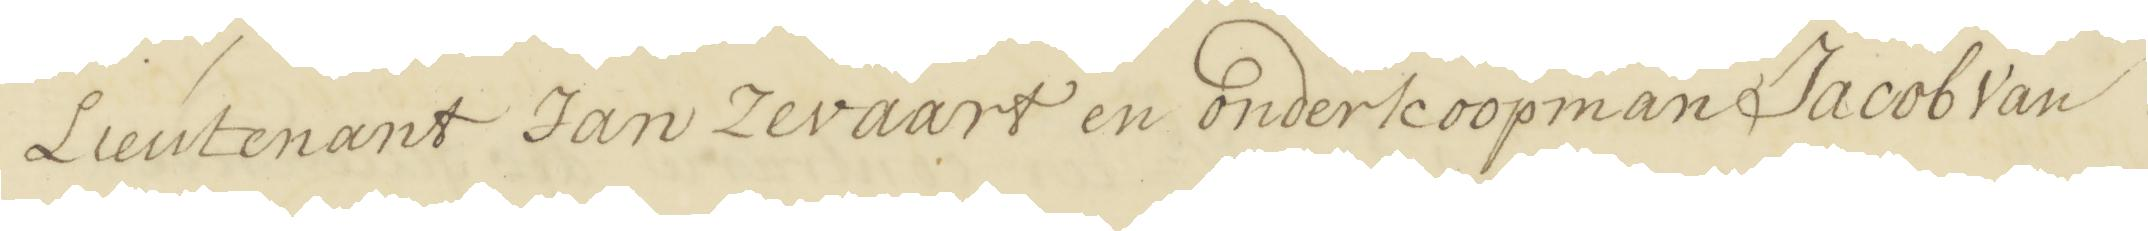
Lieutenant Jan Zevaart en onderkoopman Jacob Van
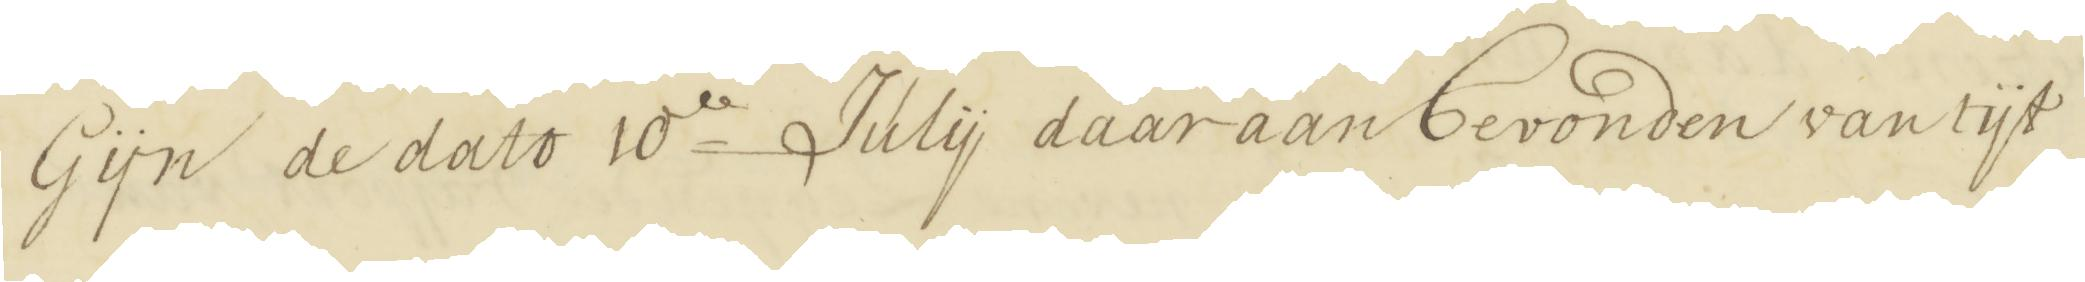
Gijn de dato 10=e Iulij daar aan bevonden van tijt
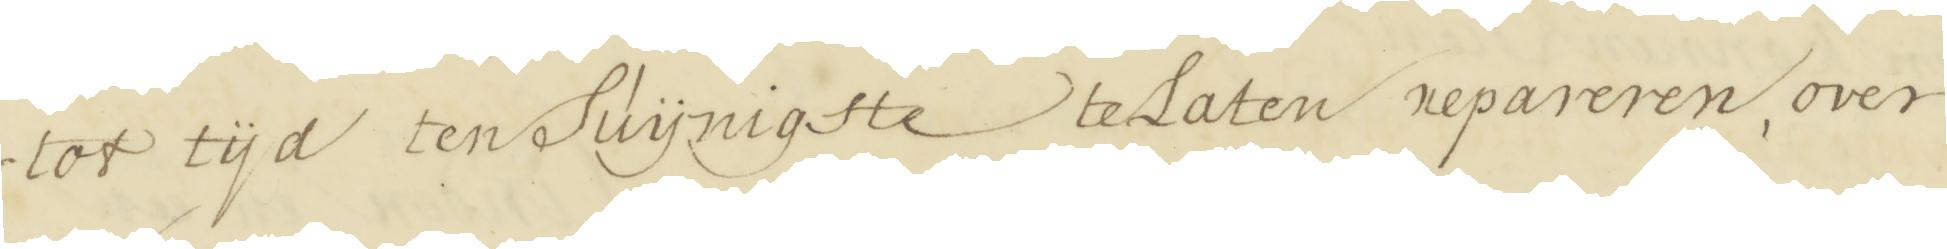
tot tijd ten Suijnigste te Laten repareren, over
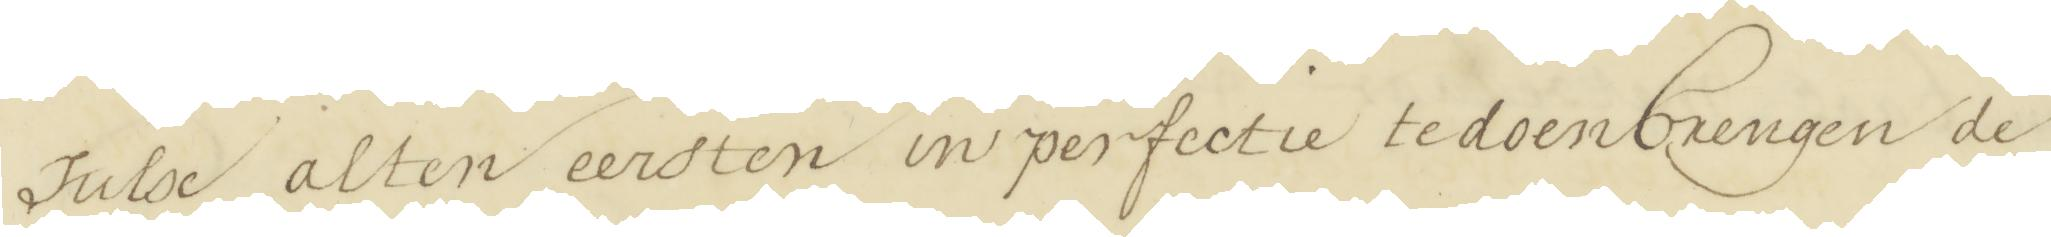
Sulx alten eersten in perfectie te doen brengen de
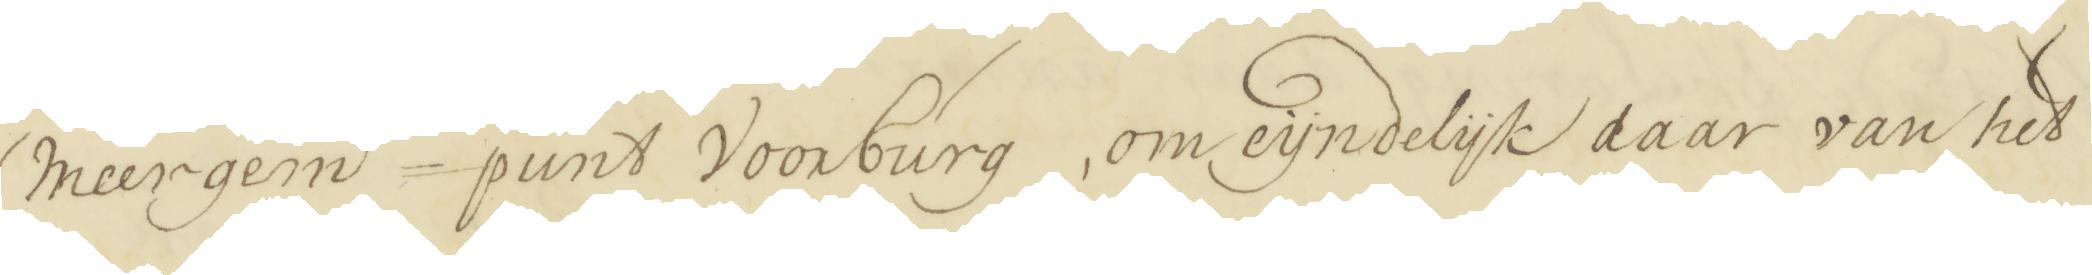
meer gem=e punt Voorburg, om eijndelijk daar van het
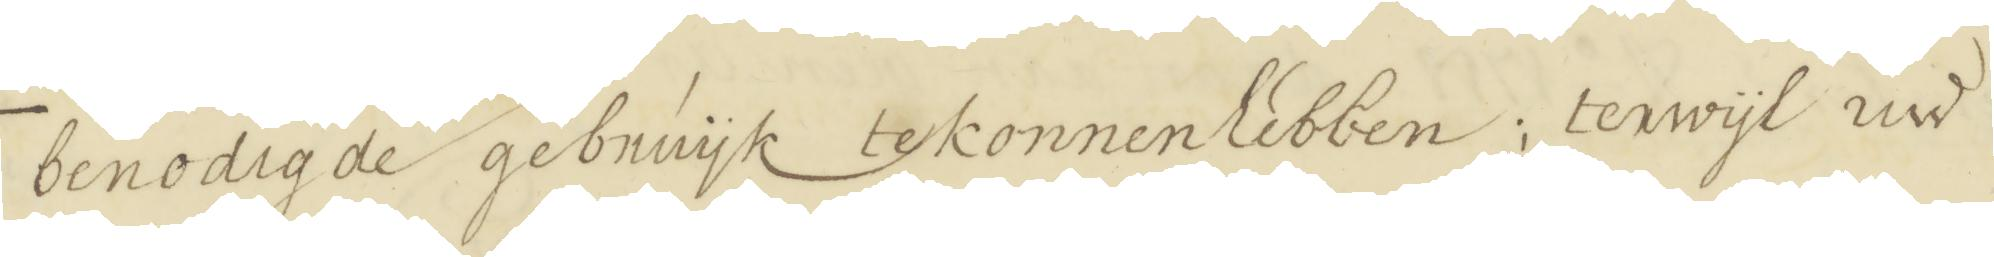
benodigde gebruijk te konnen hebben; terwijl uw
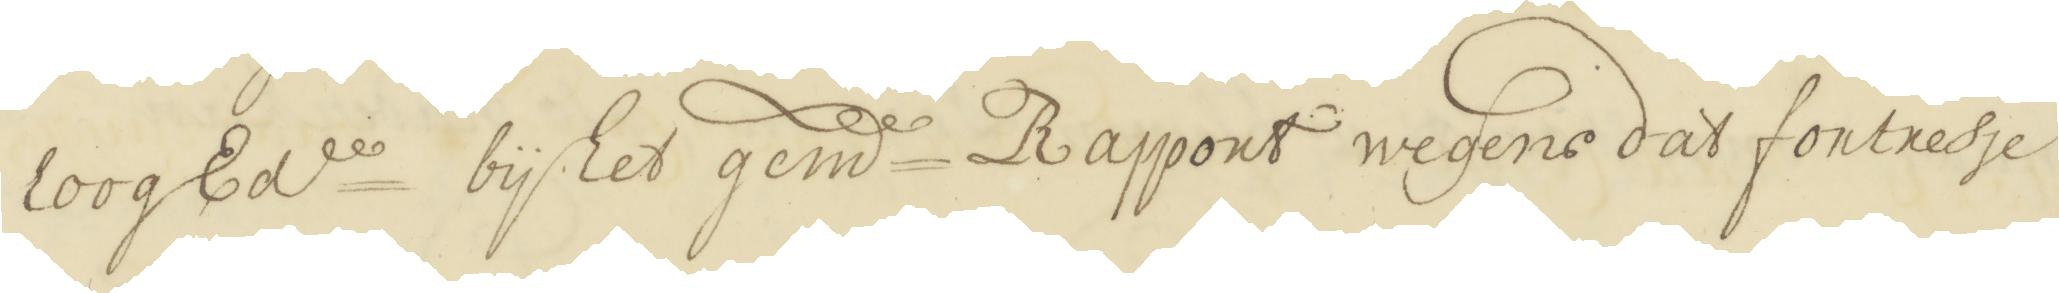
hoog Ed=le bij het gem=e Rapport wegens dat fortresje
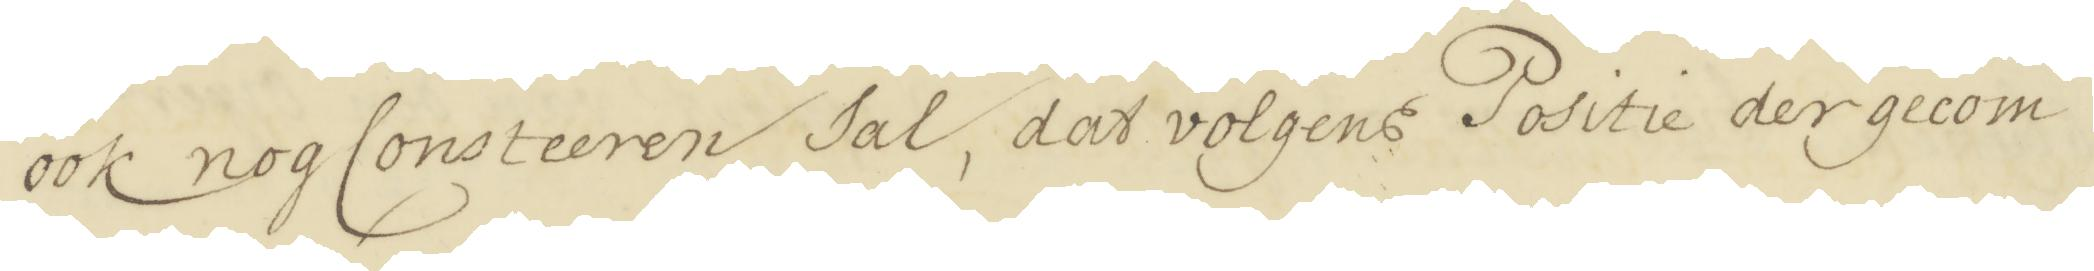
ook nog Consteeren Sal, dat volgens Positie der gecom
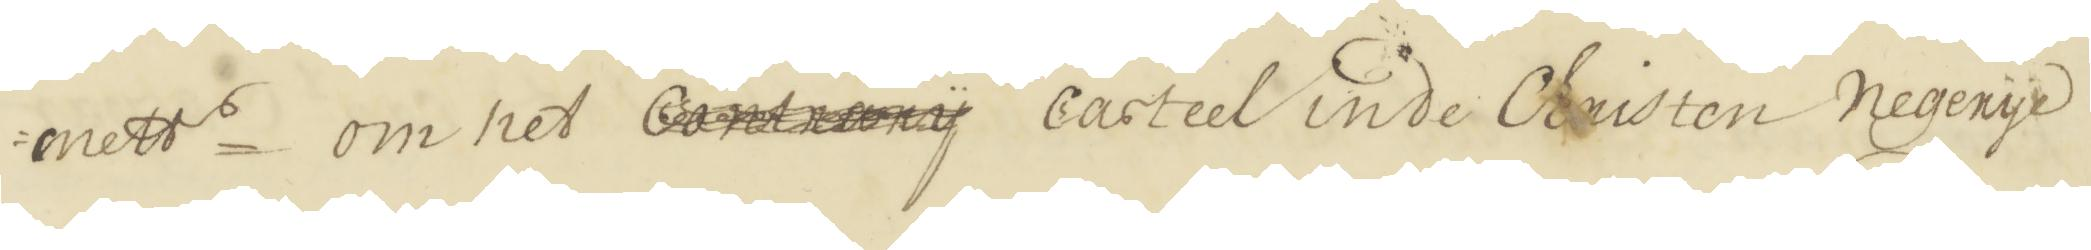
=mett=s om het Contrarij casteel in de Christen negerije
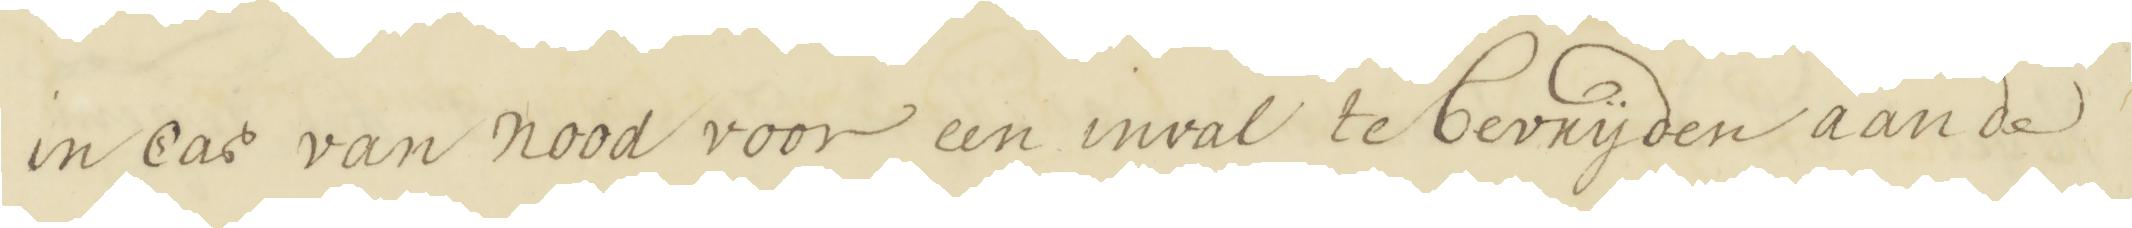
in cas van nood voor een inval te bevrijden aan de
